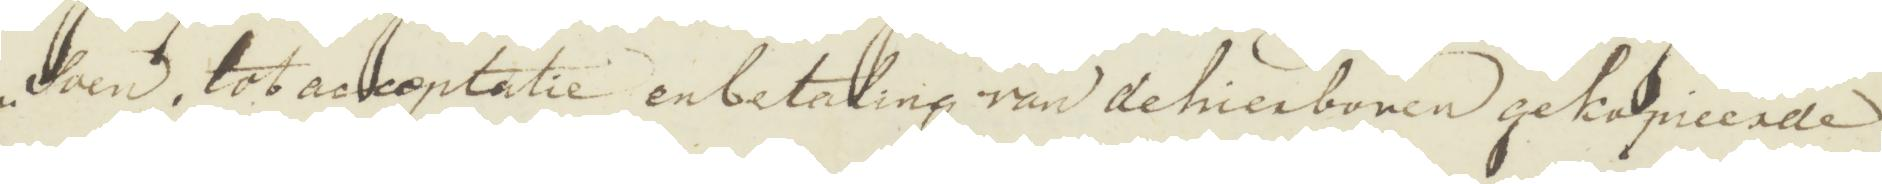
soen, tot acceptatie en betaling van de hierboven gekopieerde
